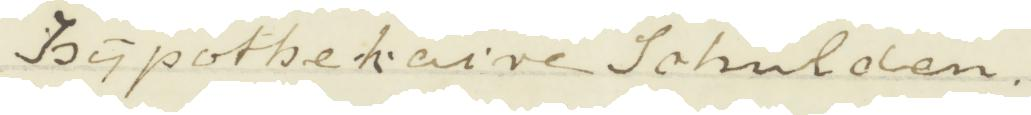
Hijpothekaire Schulden.
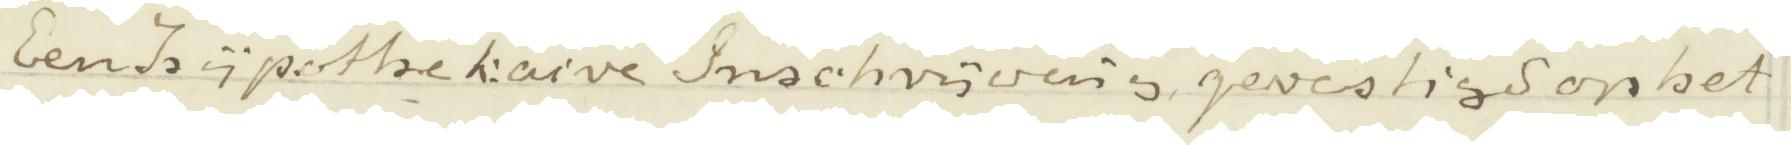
Een Hijpothekaire Inschrijving, gevestigd op het
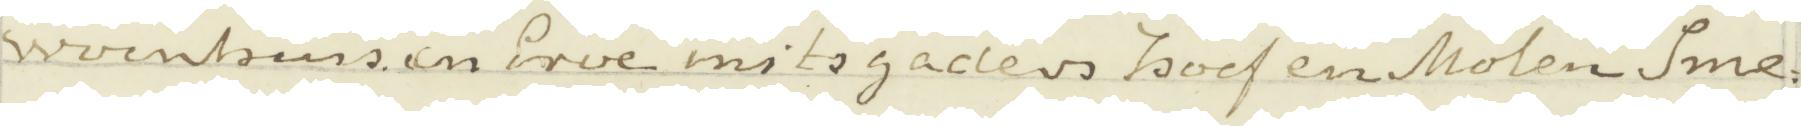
woonhuis en Erve mitsgaders Hoef en Molen Sme=
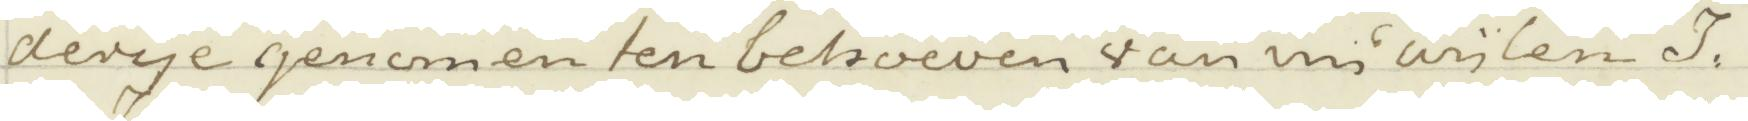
derije genomen ten behoeven van nu wijlen I.
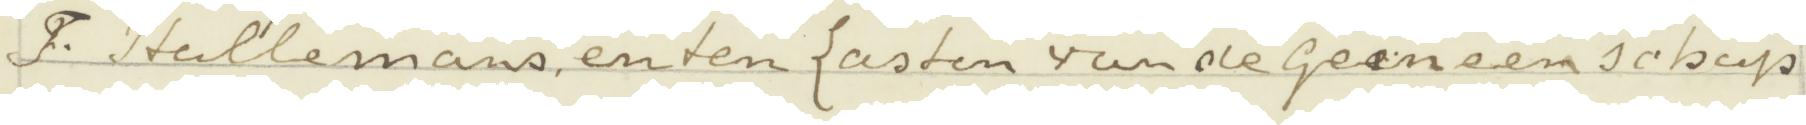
F. Hallemans, en ten Lasten van de Gemeenschap
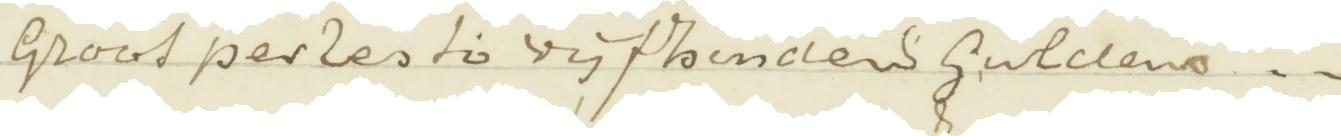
Groot per Resto vijf honderd Guldens - -
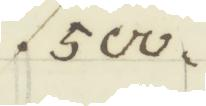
ƒ500 „
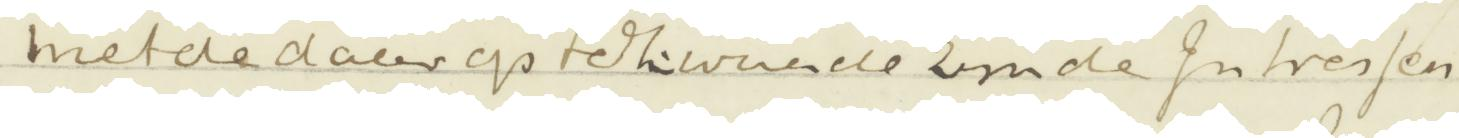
met de daar op te kwaade Zynde de Jntressen
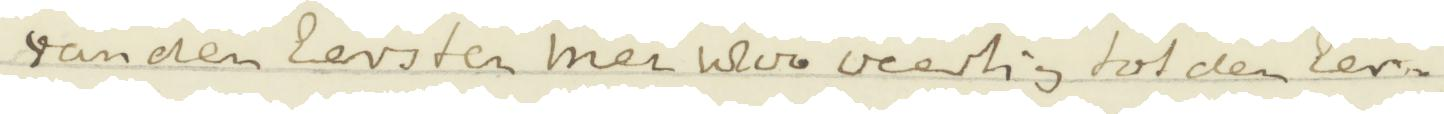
van den Eersten mei 1800 veertig tot den Eer„
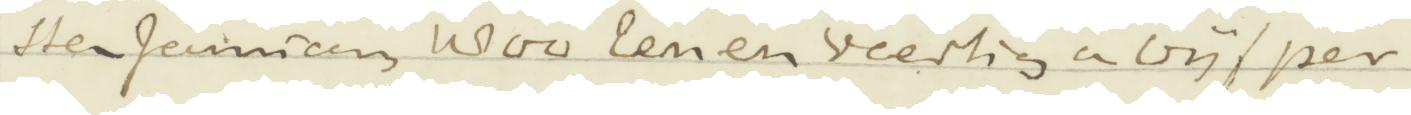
sten January 1800 Een en Veertig a vijf per
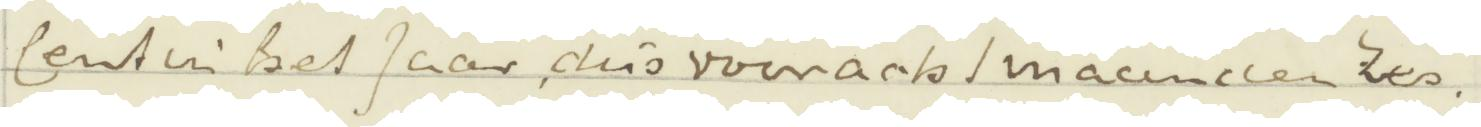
Cent in het Jaar, dus voor acht maanden Zes.
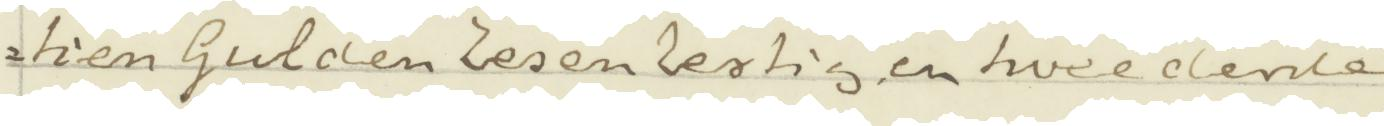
=tien Gulden Zes en Zestig, en twee derde
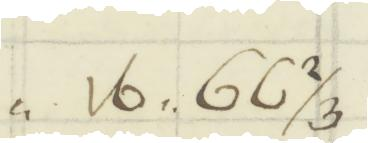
„ 16 „ 66 2/3
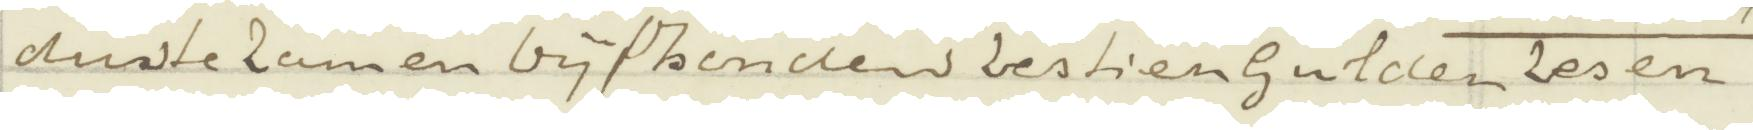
dus te Zamen vijfhonderd zestien Gulden zes en
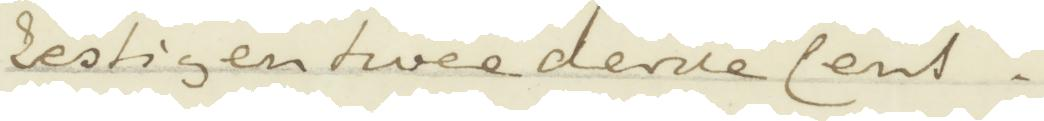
Zestig en twee derde Cent -
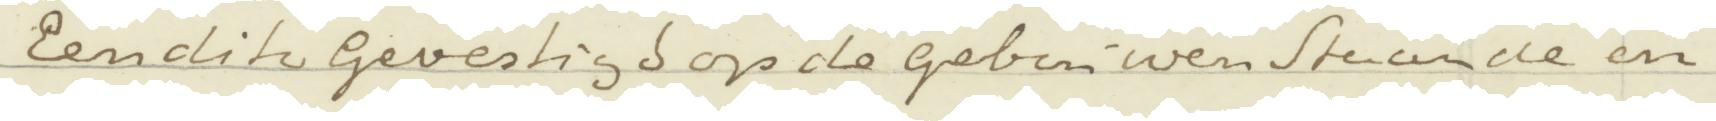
Een dito Gevestigd op de gebouwen Staande en
